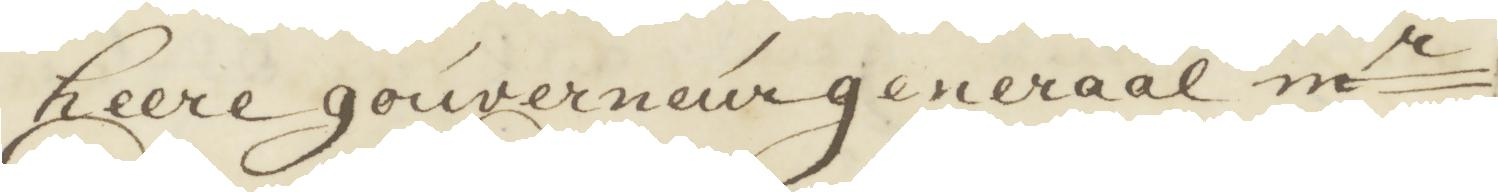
heere gouverneur generaal m:e
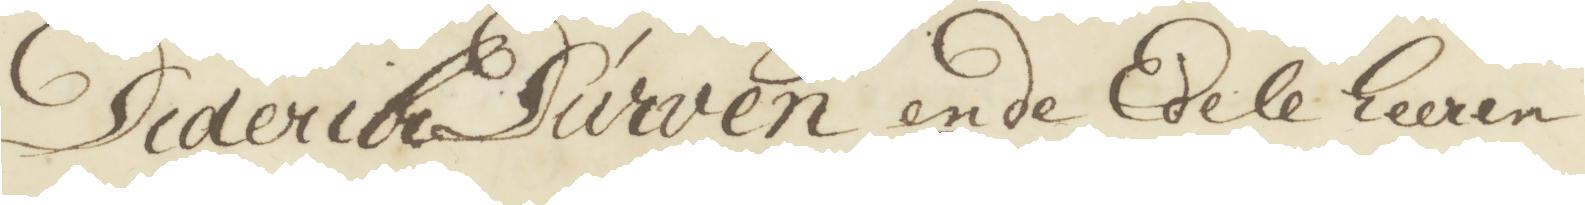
Diderik Durven ende Edele Heeren
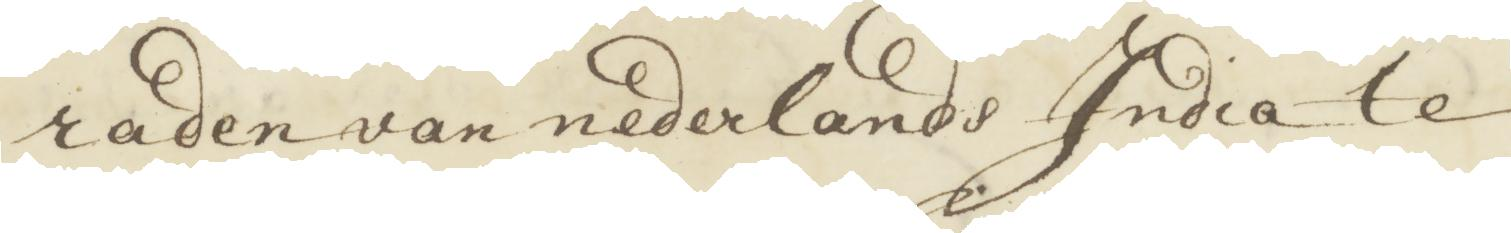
raden van nederlands India te
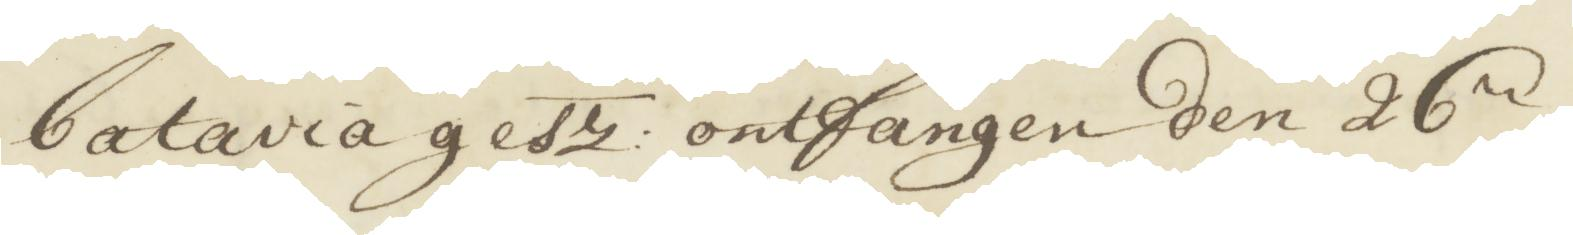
batavia gesz: ontfangen den 26:n
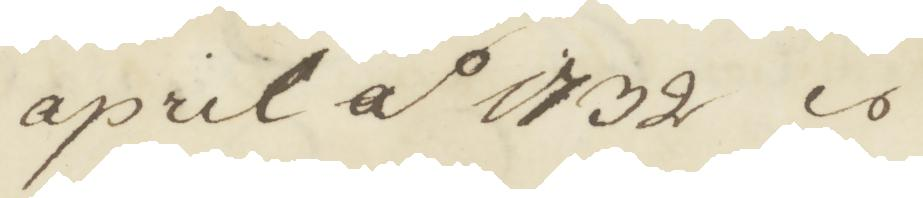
april ao 1732 —
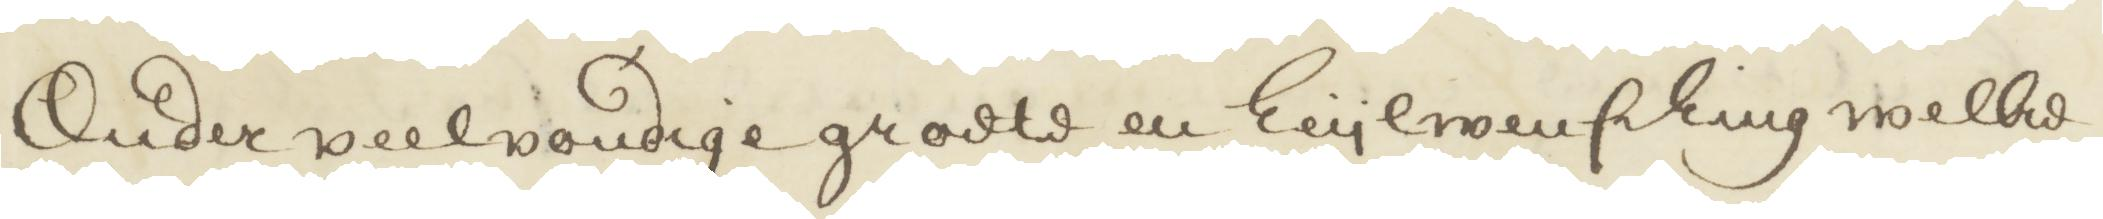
Onder veelvoudige groete en heijlwensching welke
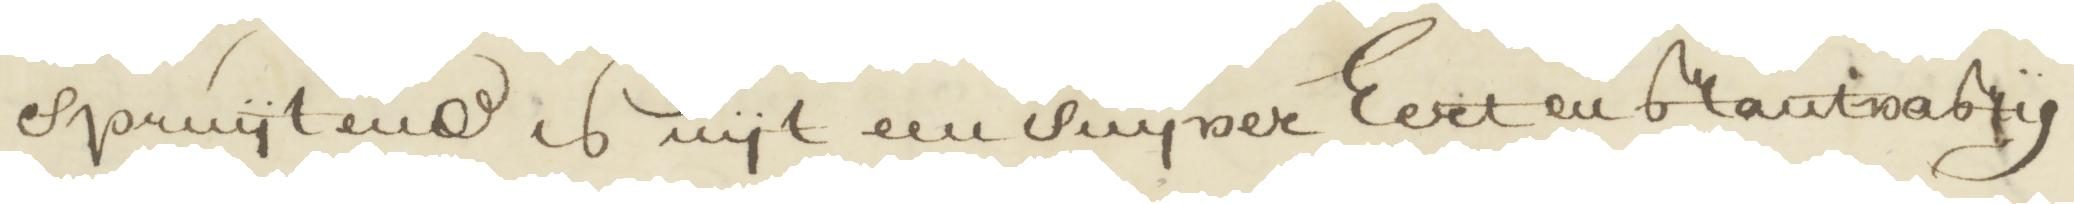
spruijtende is uijt een suijver hert en stantvastig
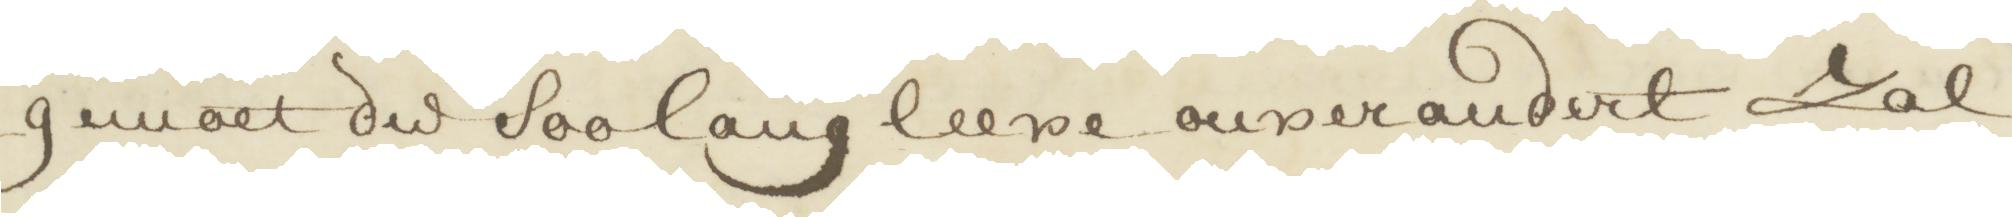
gemoet die soo lang leeve onverandert zal
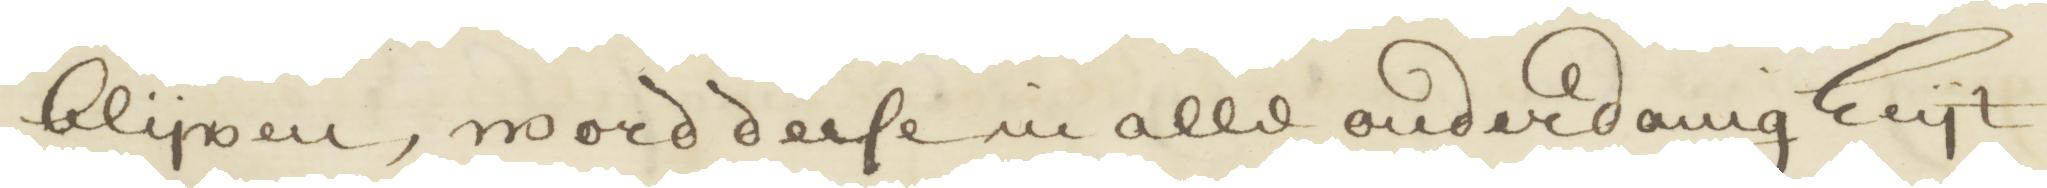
blijven, word deese in alle onderdanigheijt
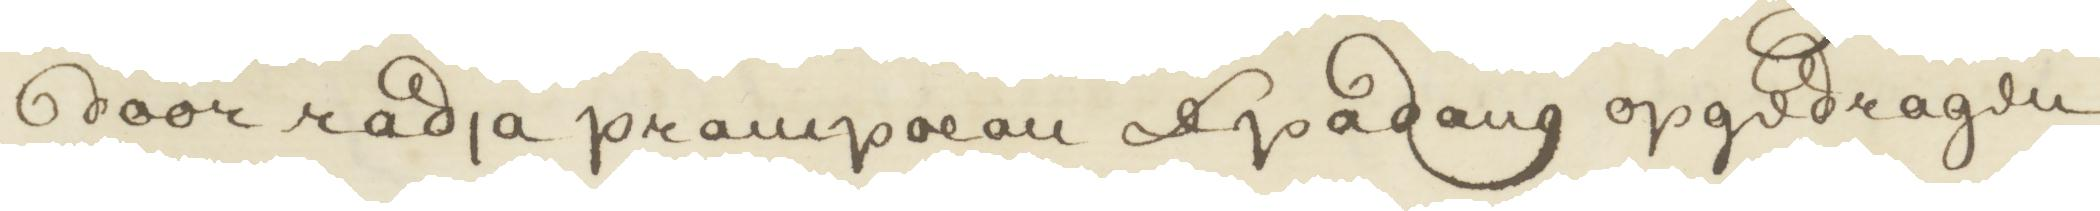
door radja prampoean te padang opgedragen
